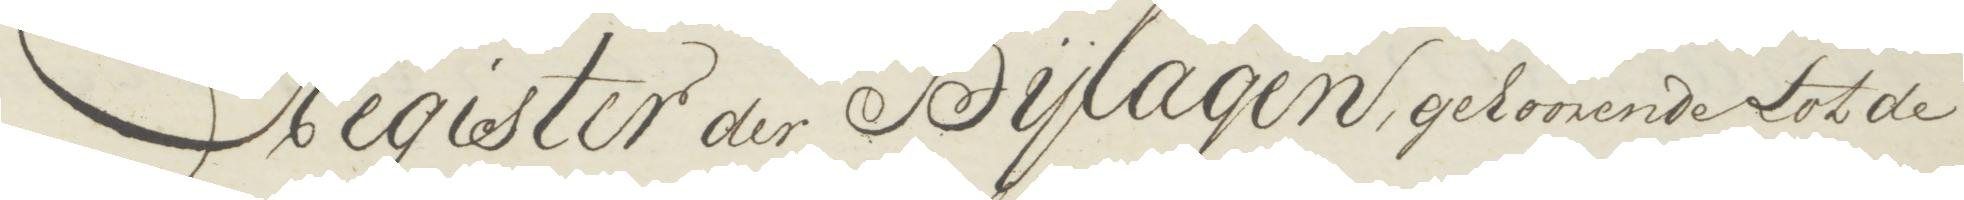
Register der Bijlagen, gehoorende tot de
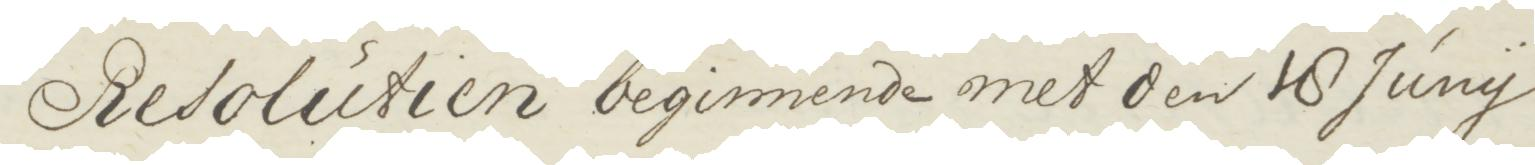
Resolutien beginnende met den 18 Junij
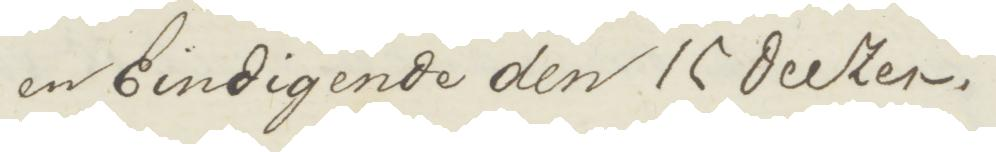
en Eindigende den 15 deezer.
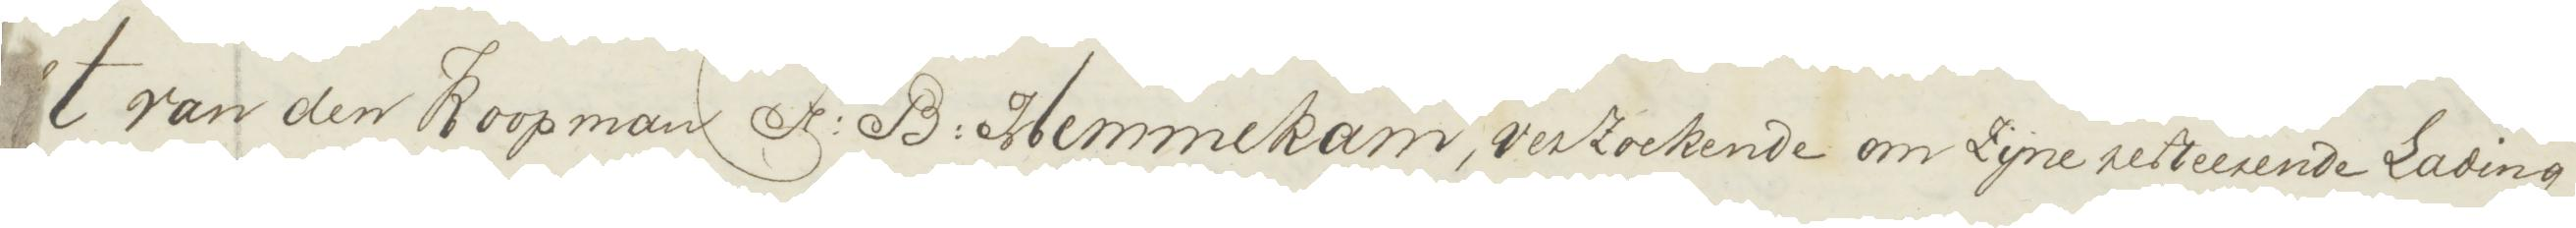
t van den Koopman F: B: Hemmekam, verzoekende om zijne resteerende Lading
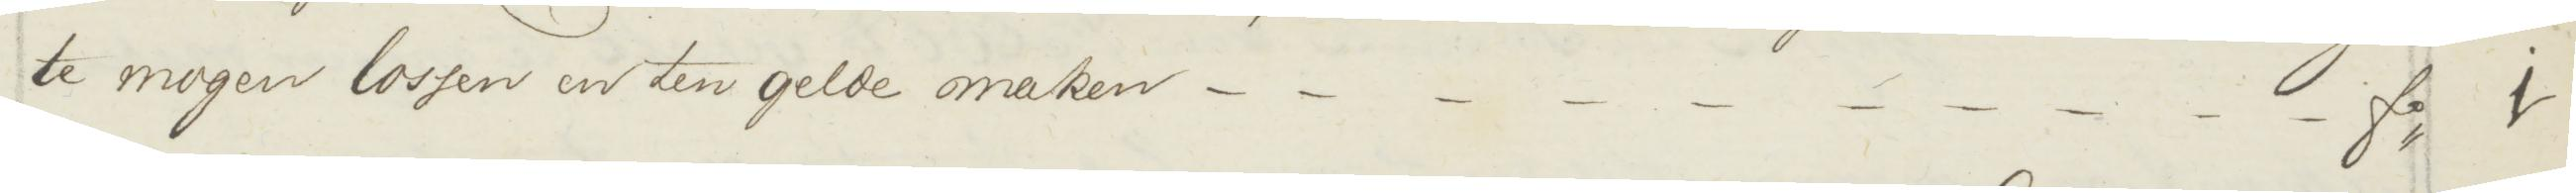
te mogen lossen en ten gelde maken - - - - - - - - - - f„o 1
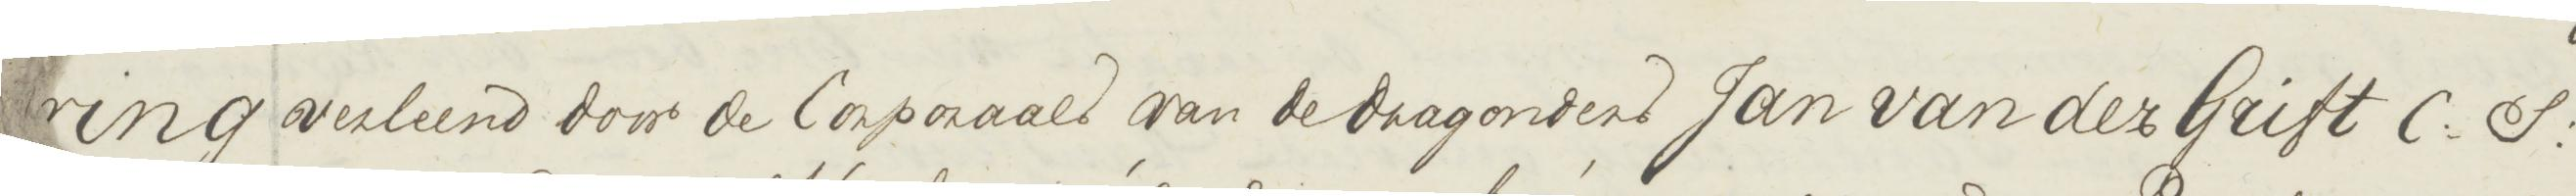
ring verleend door de Corporaal van de dragonders Jan van der Grift C: S:
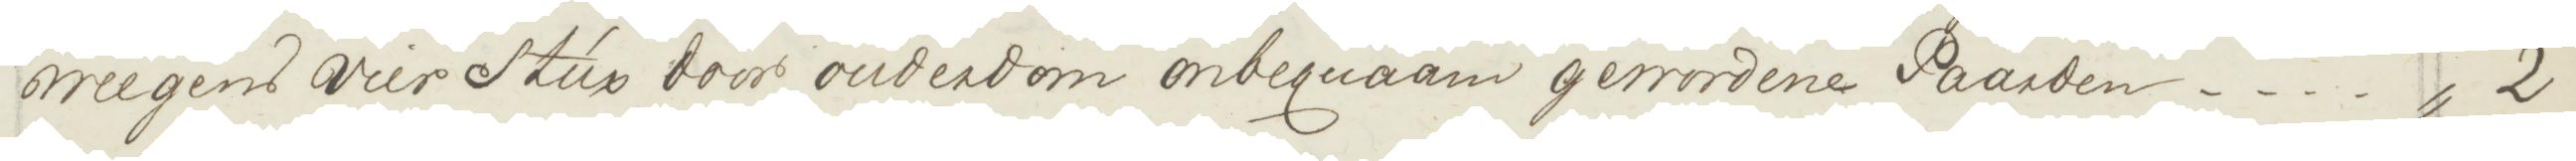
weegens vier stux door ouderdom onbequaam gewordene Paarden - - - - „ 2
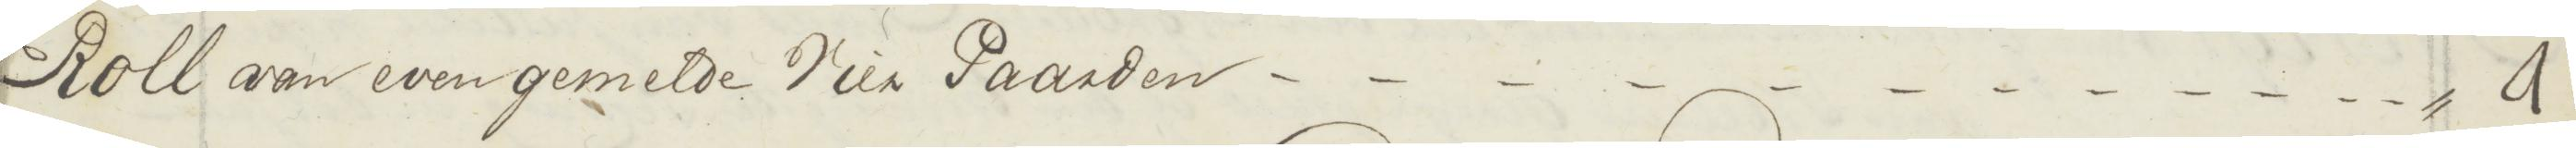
Roll van even gemelde Vier Paarden - - - - - - - - - - - - „ 4
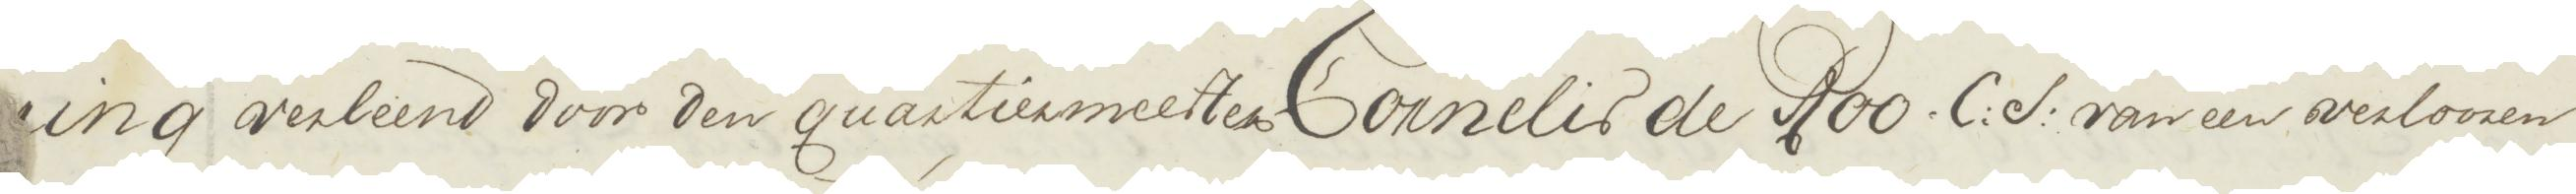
ing verleend door den quartiermeester Cornelis de Roo C: S: van een verlooren
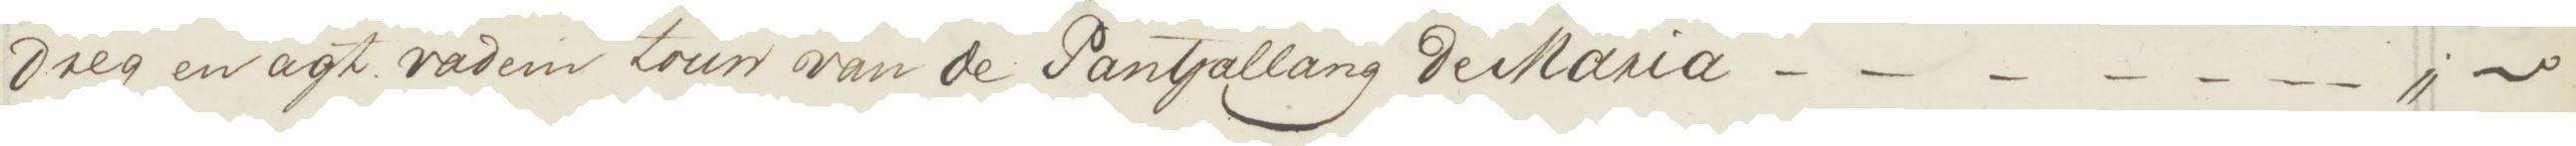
dreg en agt vadem touw van de Pantjallang de Maria - - - - - - - „ do
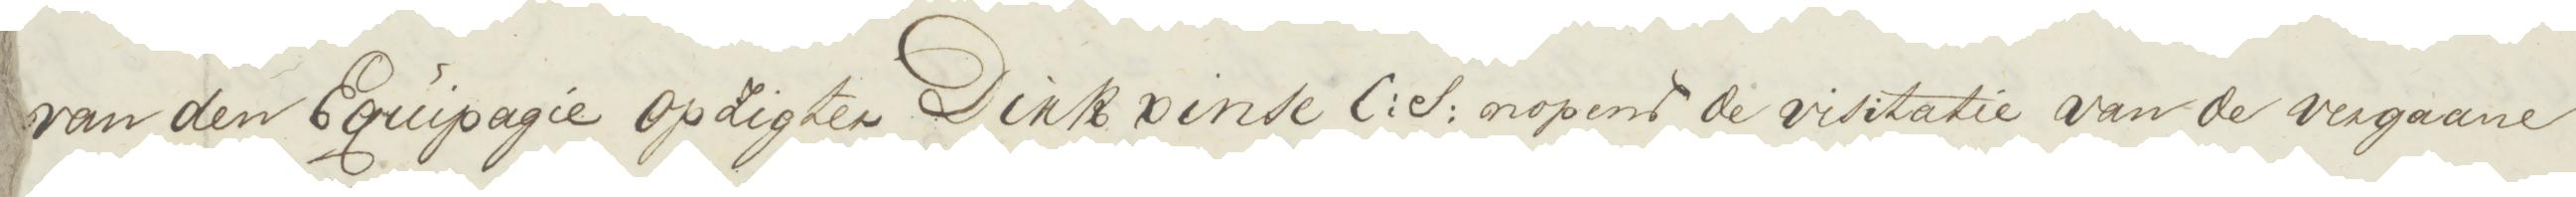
van den Equipagie opzigter Dirk vinse C: S: nopens de visitatie van de vergaane
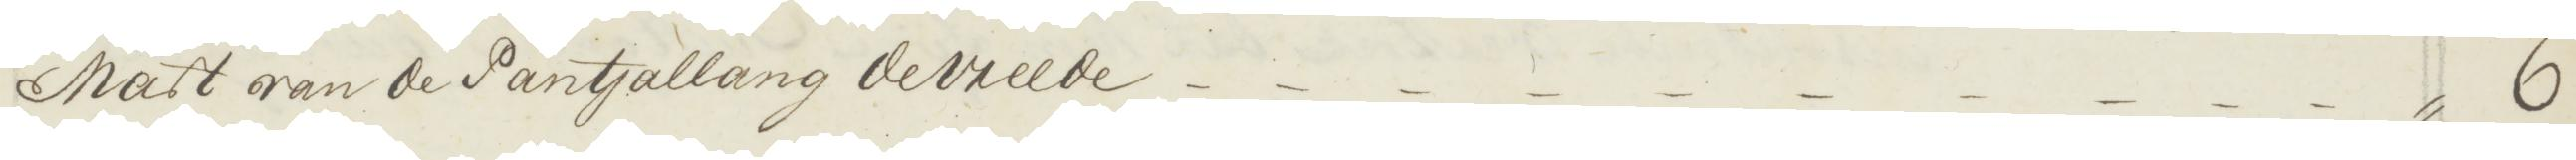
Mast van de Pantjallang de vreede - - - - - - - - - - „ 6
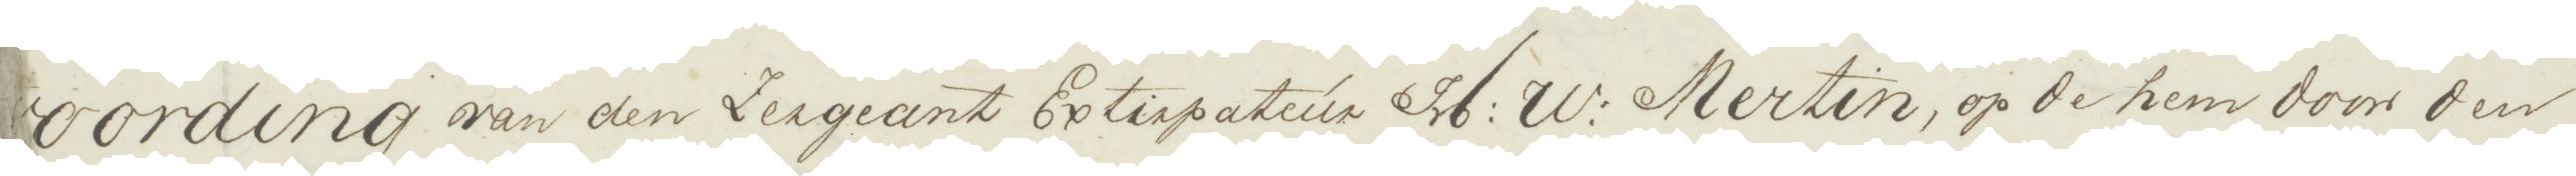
oording van den Zergeant Extirpateur H: W: Mertin, op de hem door den
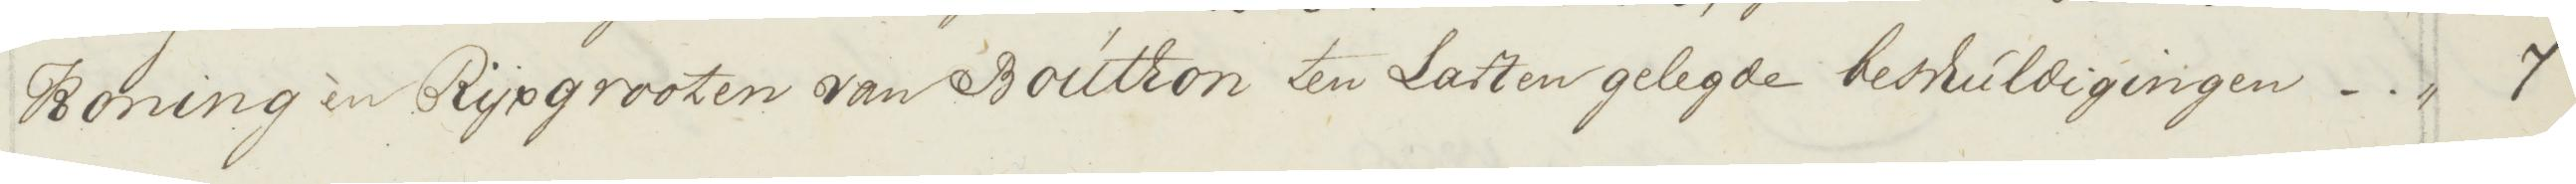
Koning en Rijxgrooten van Bouthon ten Lasten gelegde beschuldigingen - - „ 7
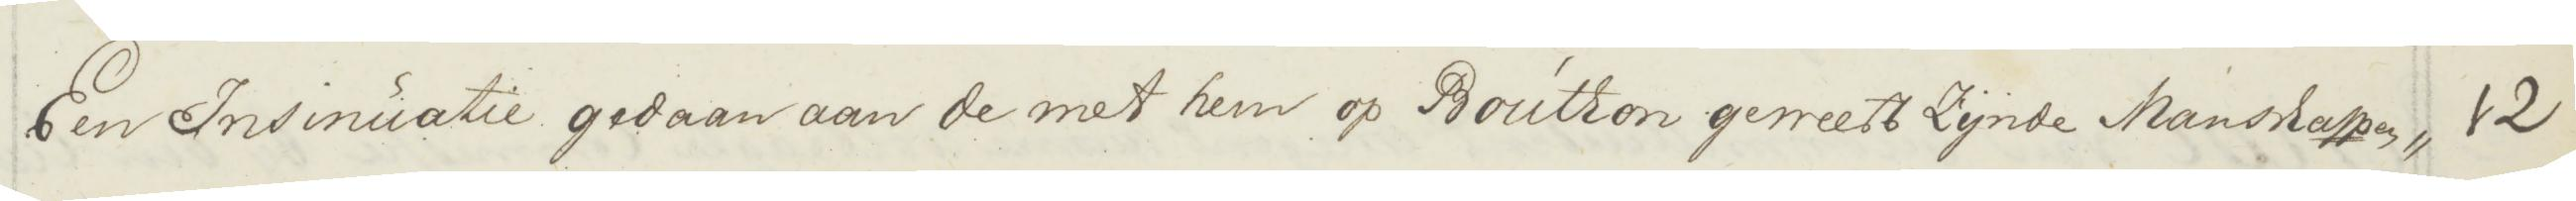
Een Insinuatie gedaan aan de met hem op Bouthon geweest zijnde Manschappen „ 12
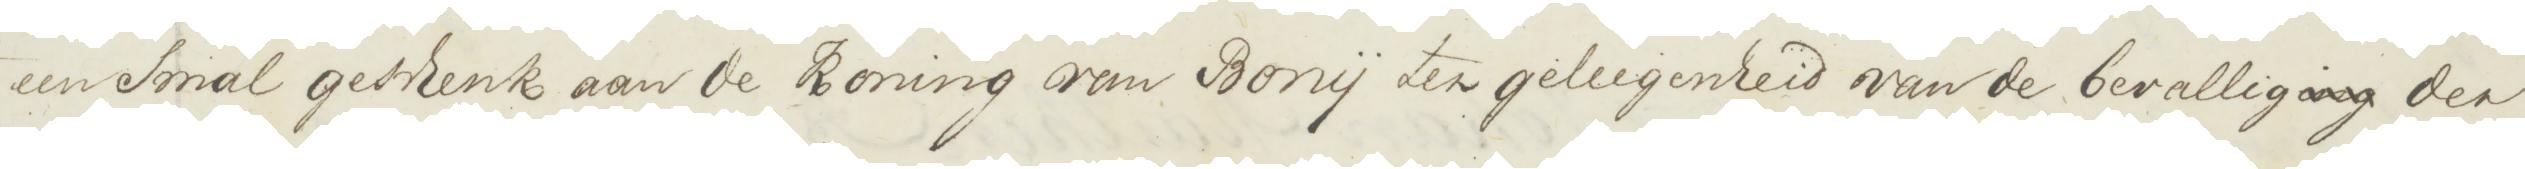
een smal geschenk aan de Koning van Bonij ter geleegenheid van de bevalliging der
